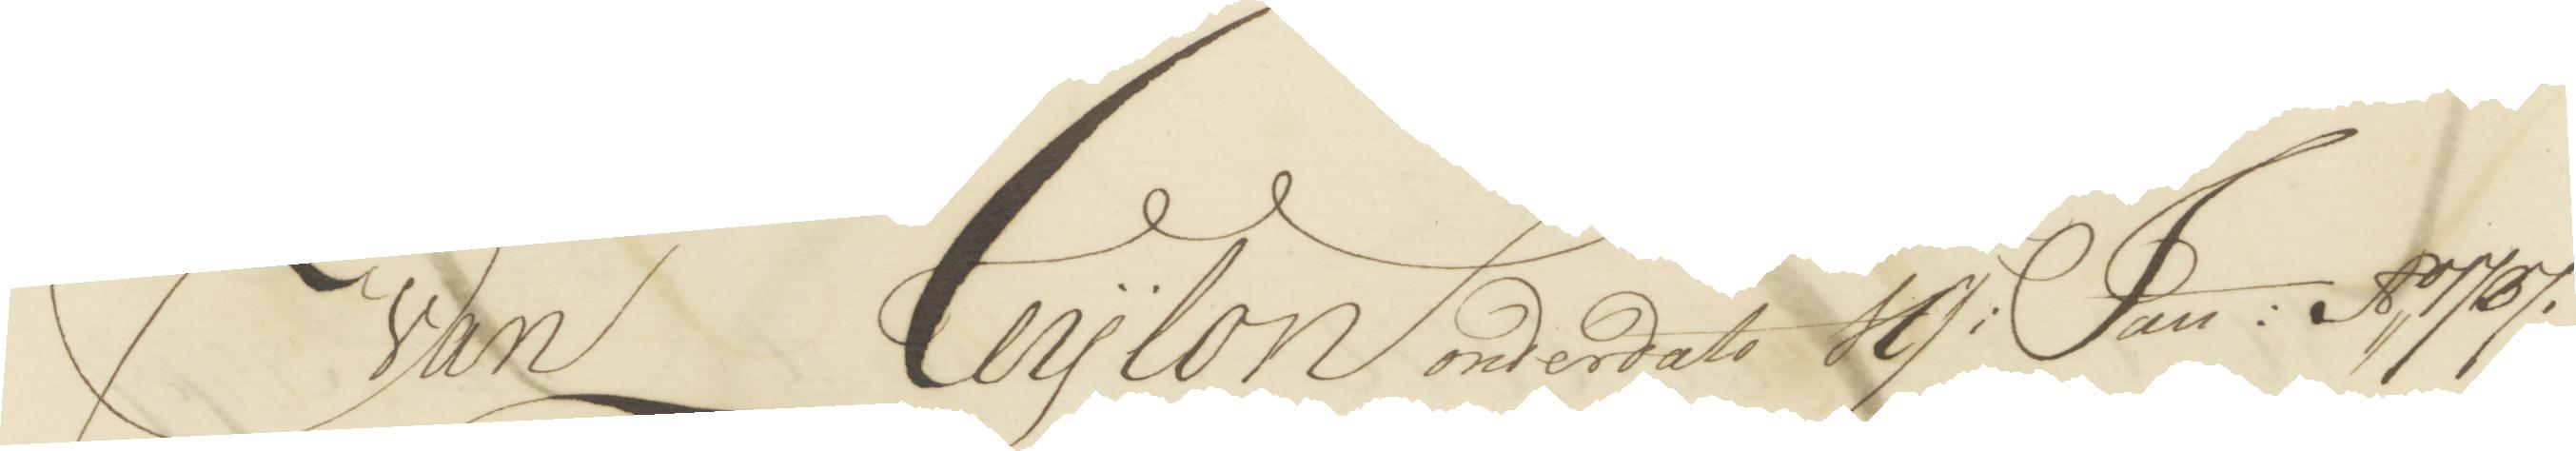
Van Ceijlon onderdato 19: Ian: A„o 1737.
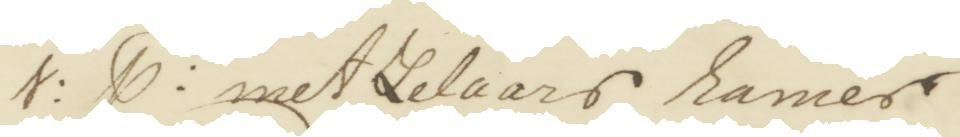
1: p:s metzelaars hamer
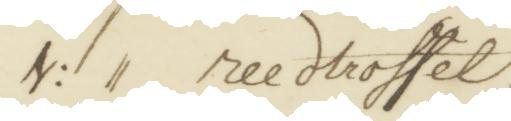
1: „ reedtroffel
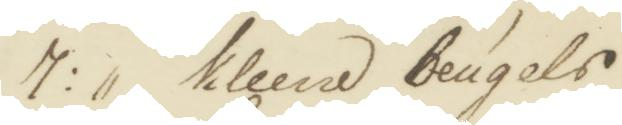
7: „ kleene beugels
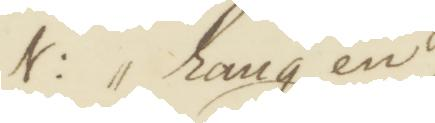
1: „ hang en
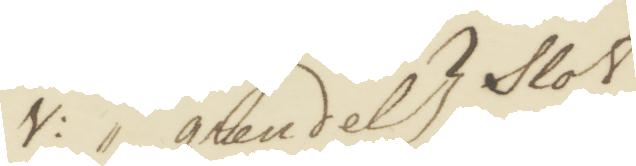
1: „ grendel} slot
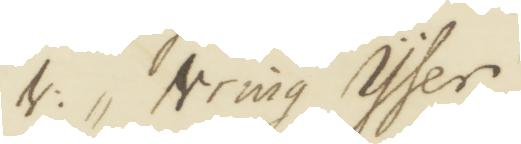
1: „ vring ijser
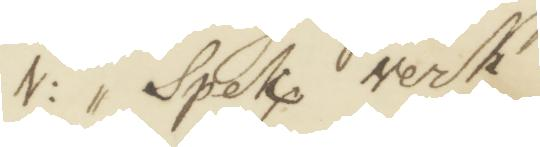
1: „ spek verk
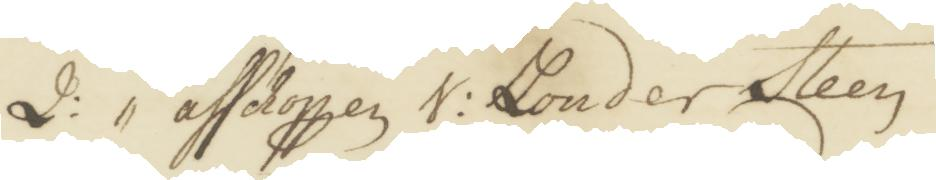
2: „ asschoppen 1: zonder steen
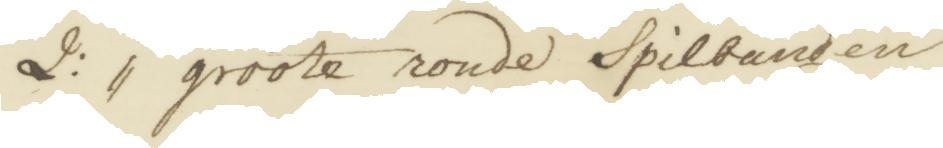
2: „ groote ronde spilbanden
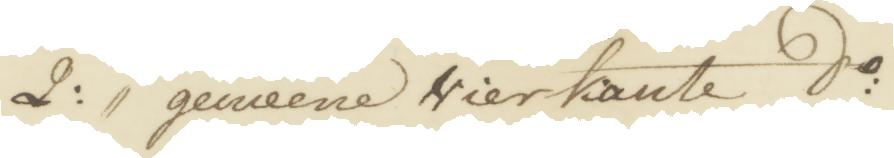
2: „ gemeene vierkante d:o
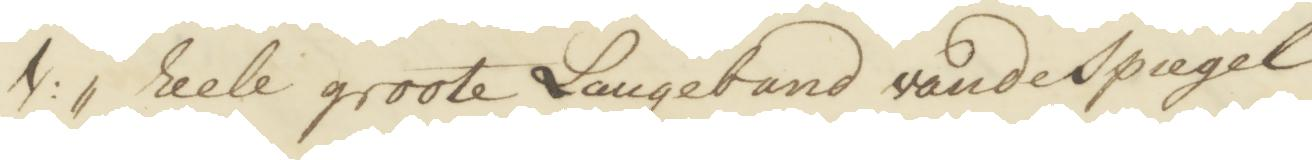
1: „ heele groote Langeband vandespiegel
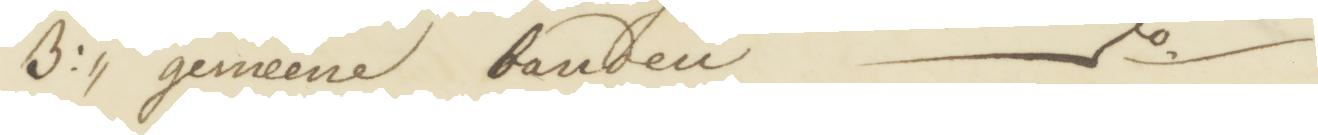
3: „ gemeene banden d-o
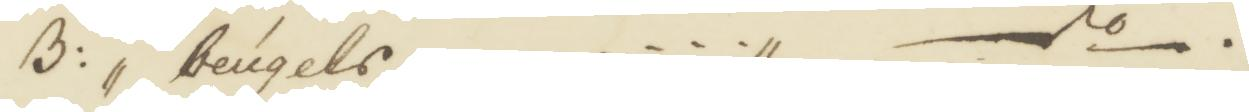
3: „ beugels - - - - - - - „ d-o .
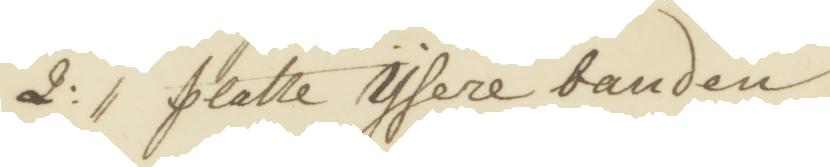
2: „ platte ijsere banden
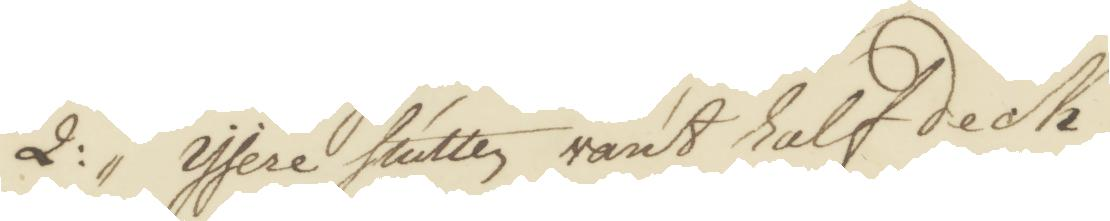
2: „ ijsere stutten van’t half deck
